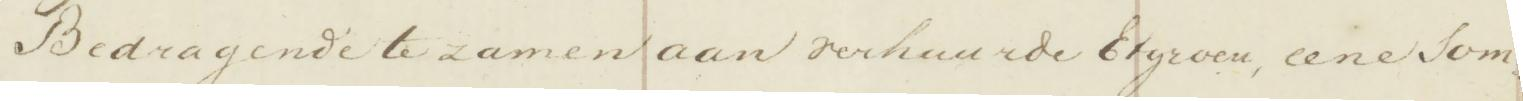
Bedragende te zamen aan verhuurde Etgroen, eene som„
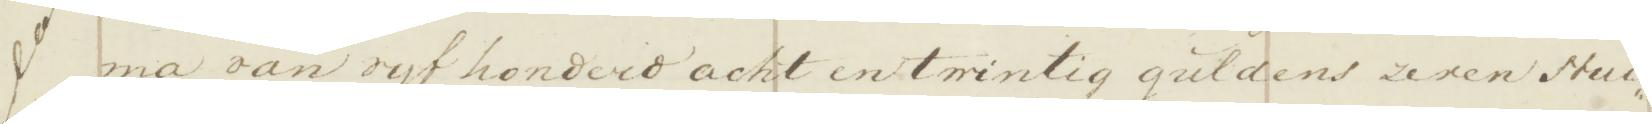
ma van vyf honderd acht en twintig guldens zeven stui„
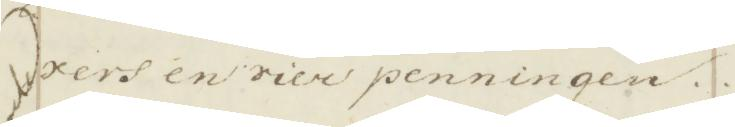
vers en vier penningen..
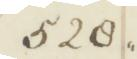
528„
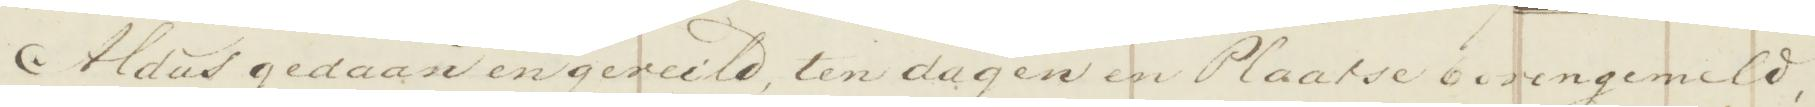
Aldus gedaan en geveild, ten dagen en Plaatse bovengemeld,
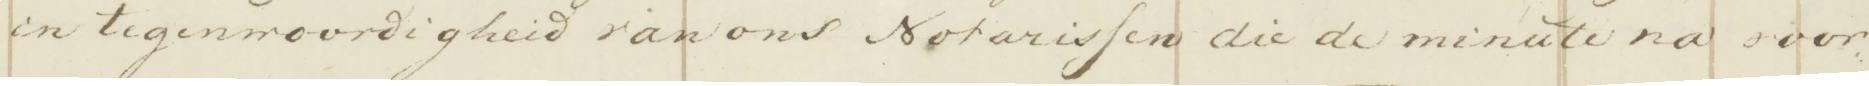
in tegenwoordigheid van ons Notarissen die de minute na voor„
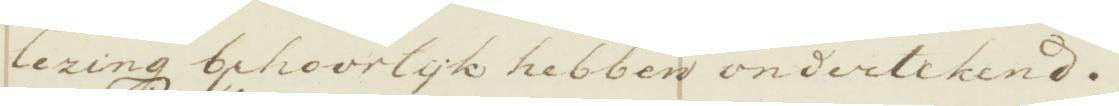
lezing behoorlijk hebben ondertekend.
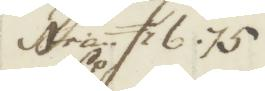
Tran ƒ6.75
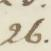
26.
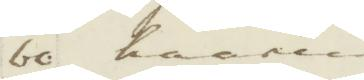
60 haarlem
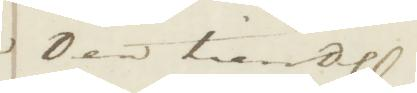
den tienden
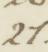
27.
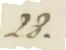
28.
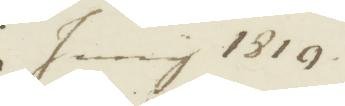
Juny 1819.
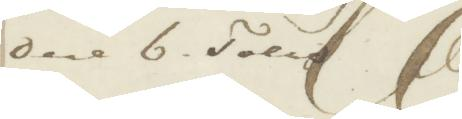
den 6. Folio
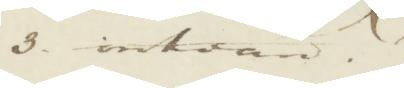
3. ontvan.
